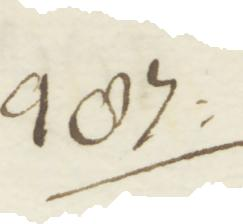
487:
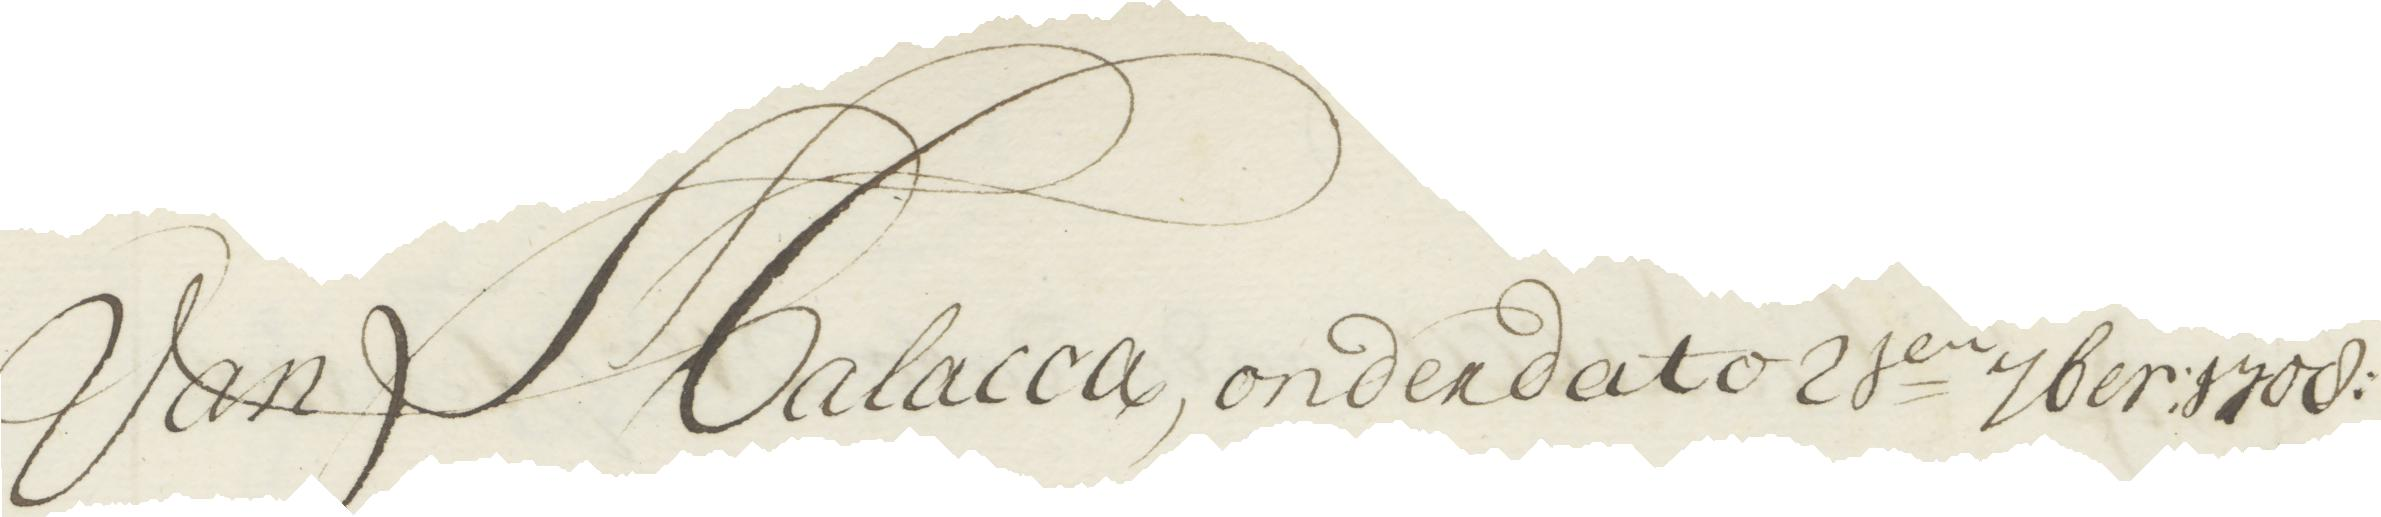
Van Malacca, onder dato 21=en 7ber: 1708:
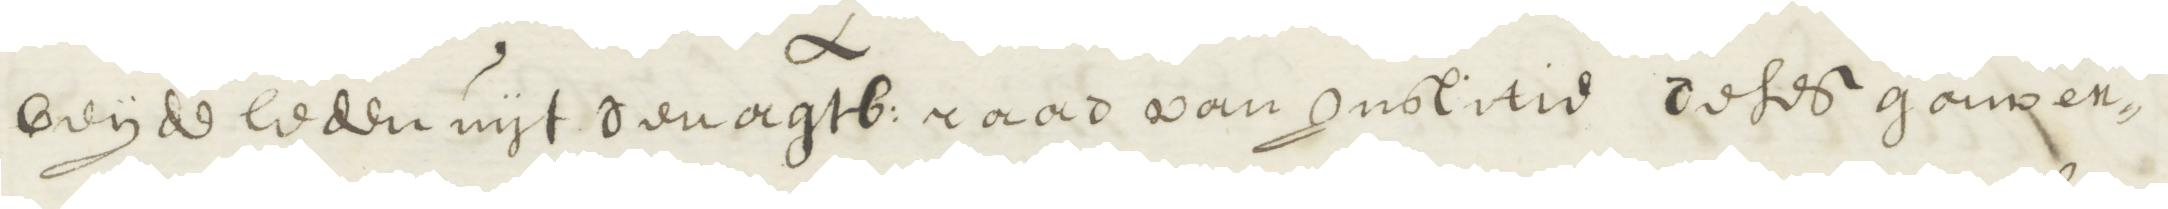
beijde leden uijt den agtb: raad van justitie deses gouver„
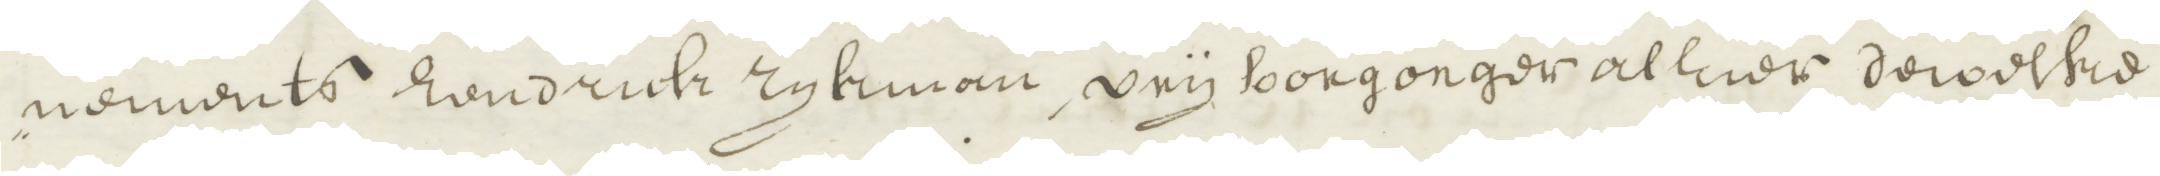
„nements hendrick rykman, vrij borgorger alhier dewelke
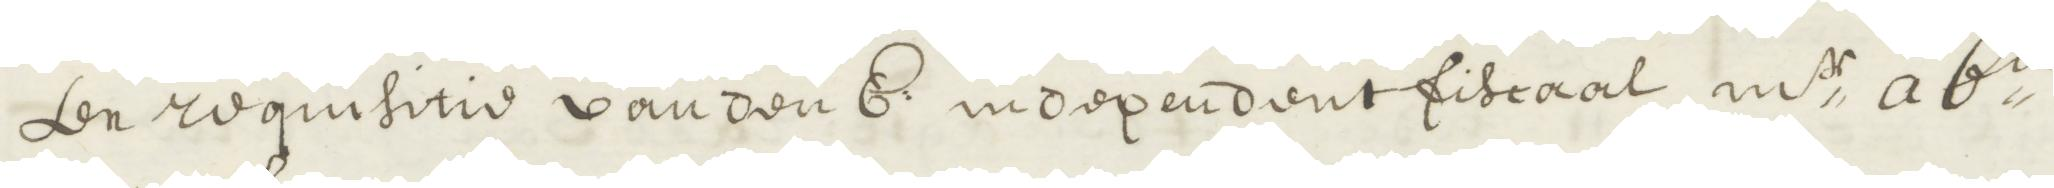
ter requisitie van den E: independent fiscaal m„r ab„m
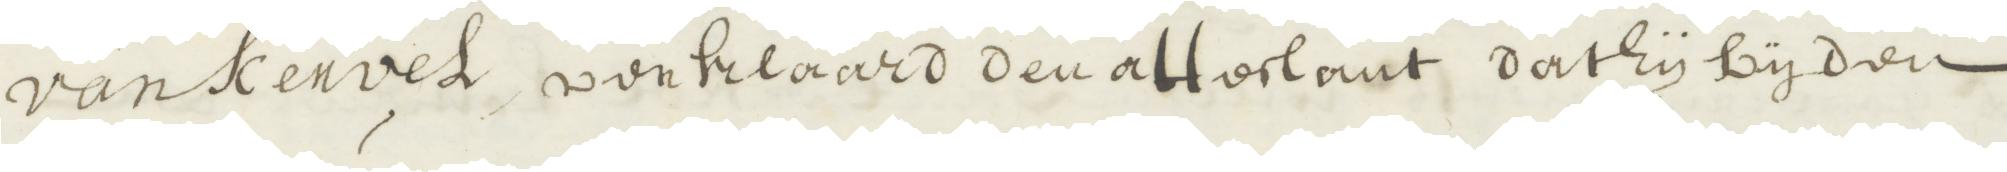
van kervel, verklaard den attestant dat hij bij den
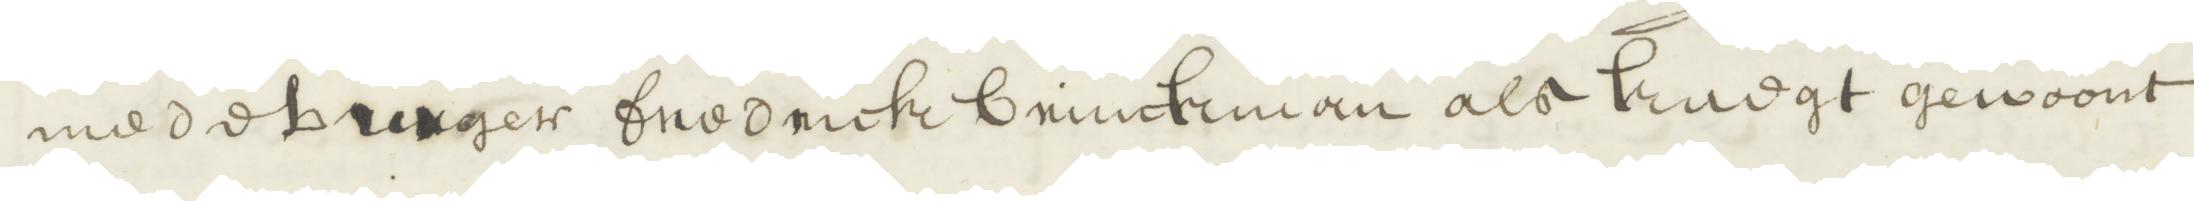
mede burger fredrick brinckman als knegt gewoont
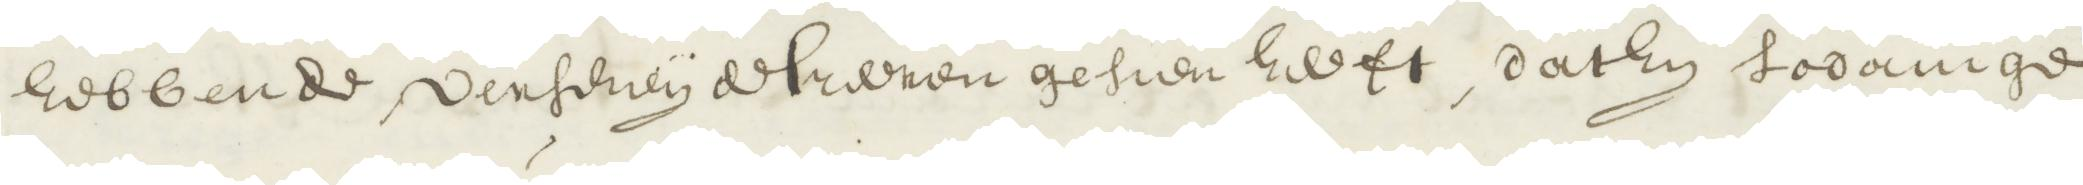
hebbende, verscheijde keeren gesien heeft, dathy sodanige
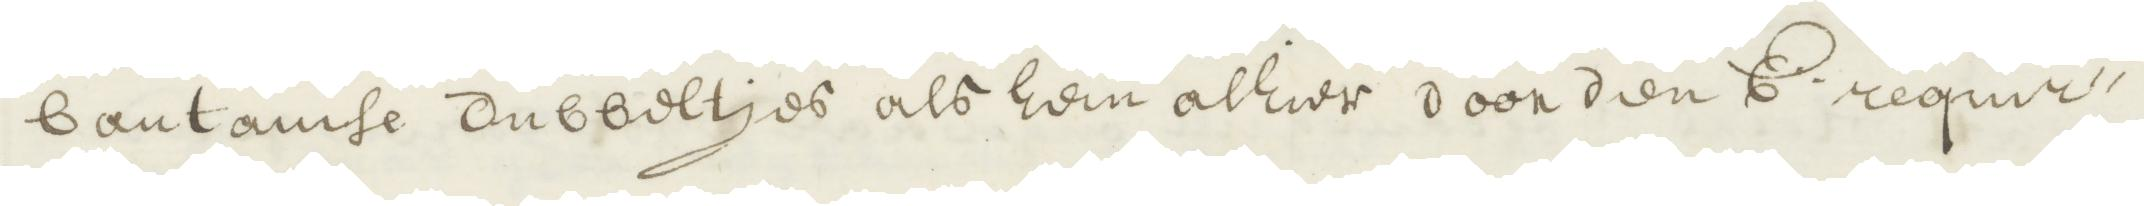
bantamse dubbeltjes als hem alhier door den E: requir„t
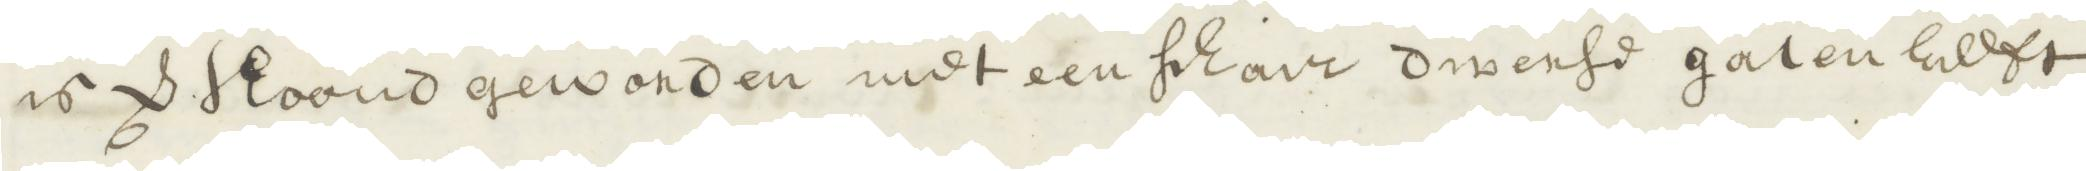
is verthoond geworden met een schair diverse gaten heeft
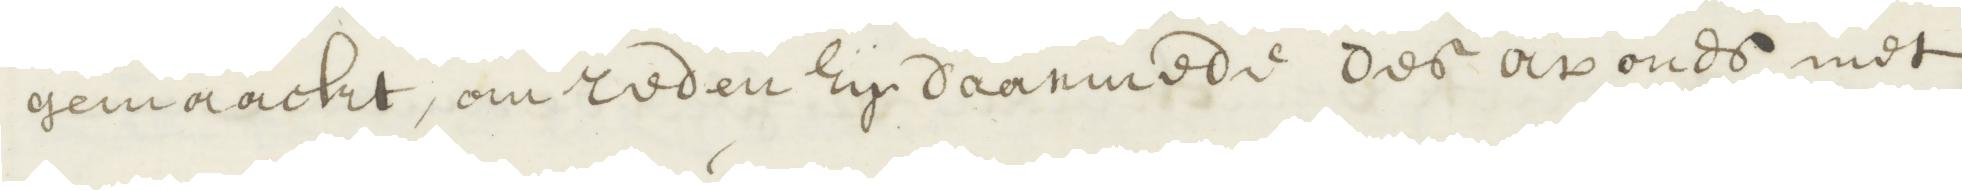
gemaackt, om reden hij daarmede des avonds niet
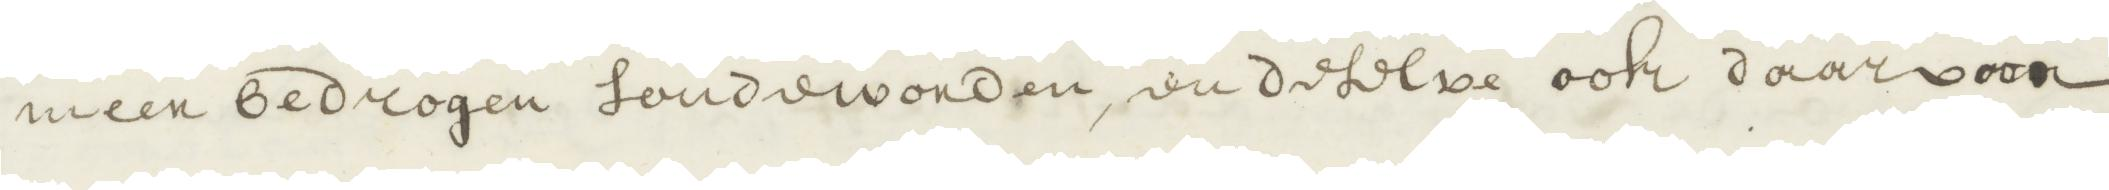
meer bedrogen soude worden, en deselve ook daarvoor
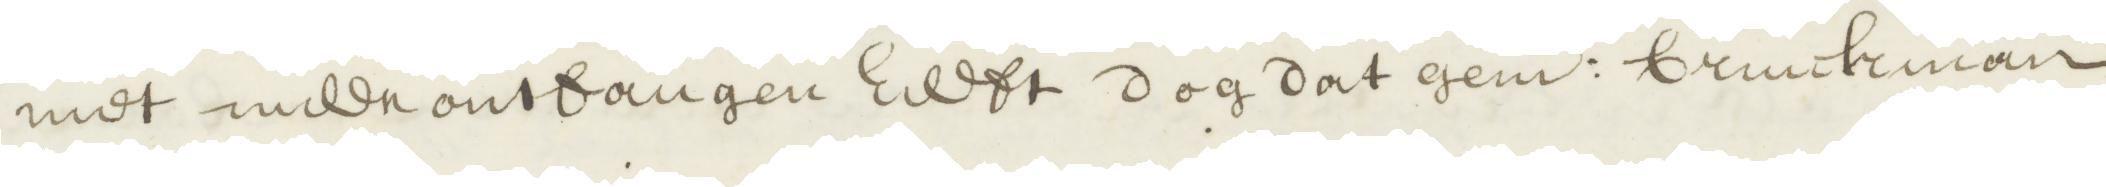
niet meer ontfangen heeft dog dat gem: brinckman
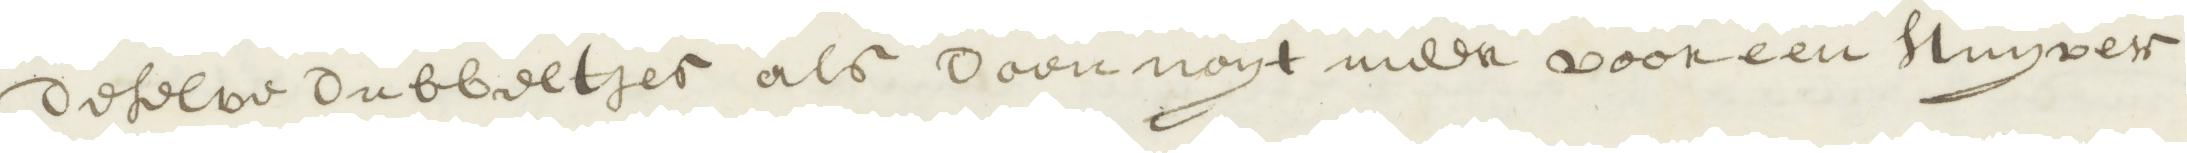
deselve dubbeltjes als doen noijt meer voor een stuijver
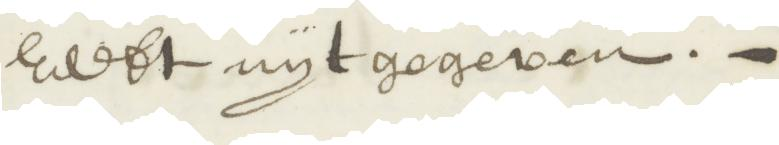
heeft uijt gegeven.—
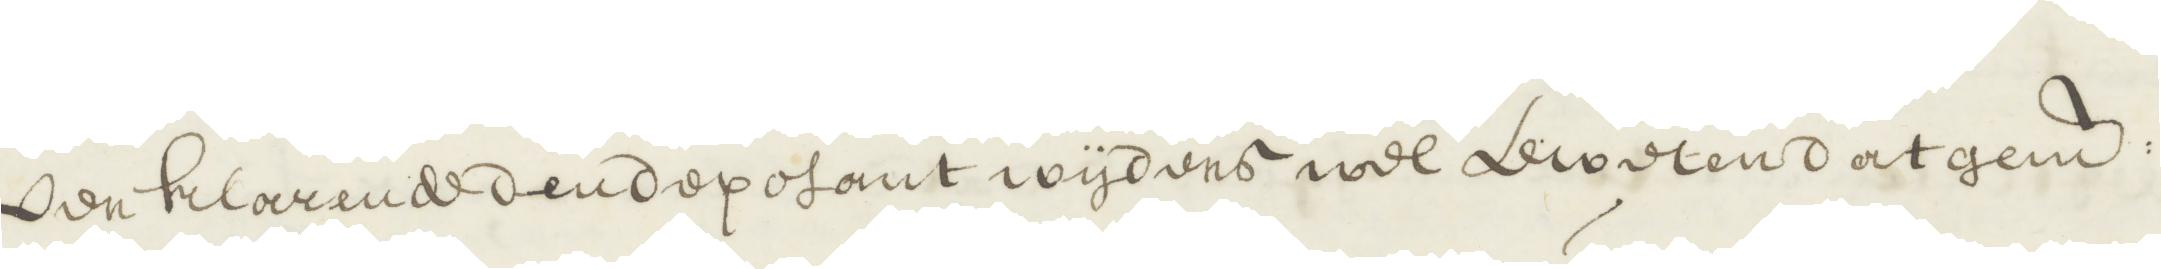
Verklarende den deposant wijders wel teweten dat gem:'
